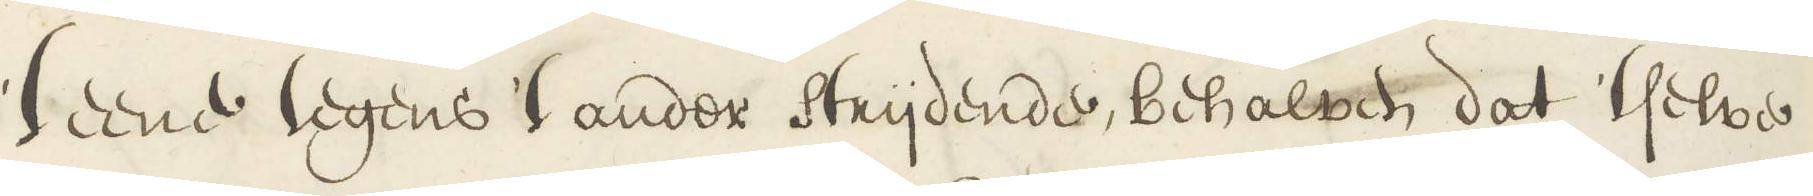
’t eene tegens ’t ander strijdende, behalven dat ’tselve
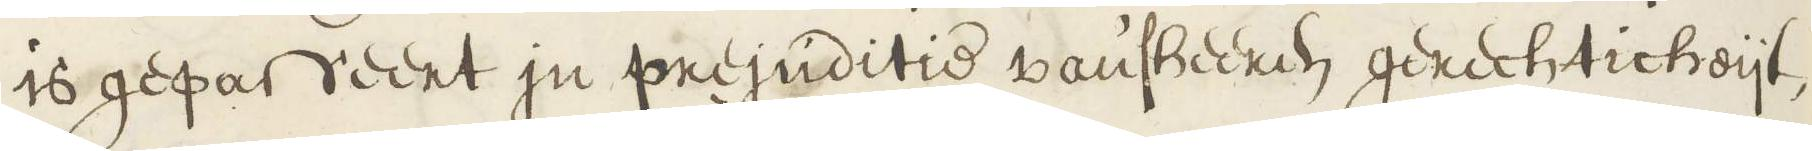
is gepasseert jn prejuditie van 'sheeren gerechticheijt,
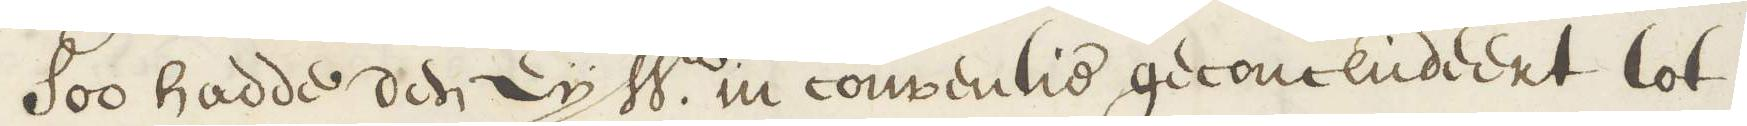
soo hadde den Eijss.r in conventie geconcludeert tot
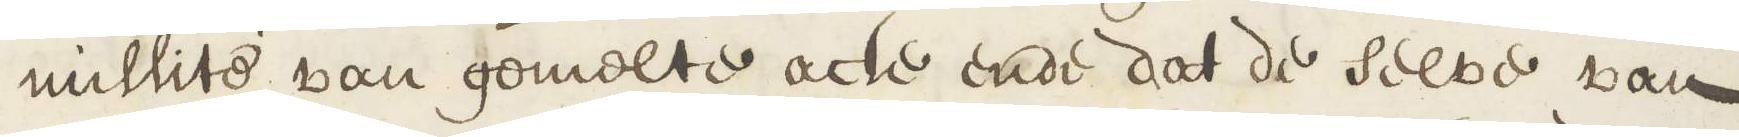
nullité van gemelte acte ende dat de selve van
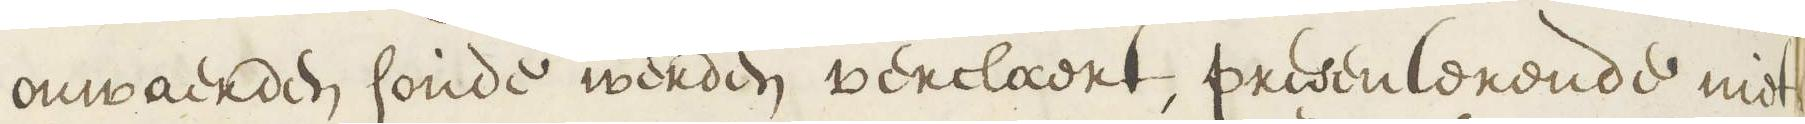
onwaerden soude werden verclaert, presenterende niet
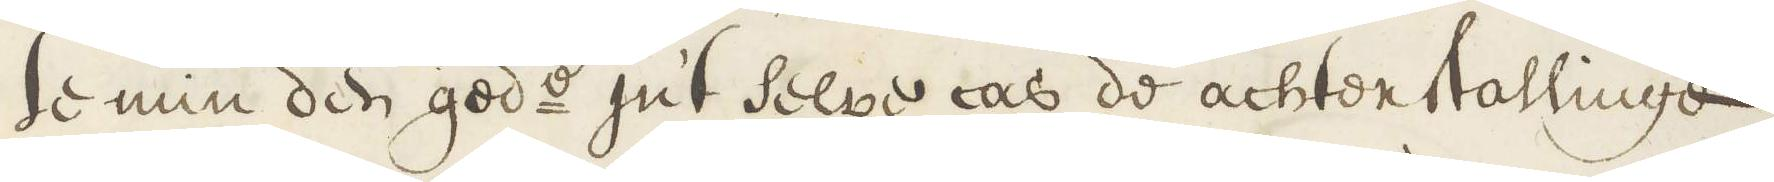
te min den ged=e jn't selve cas de achterstallinge
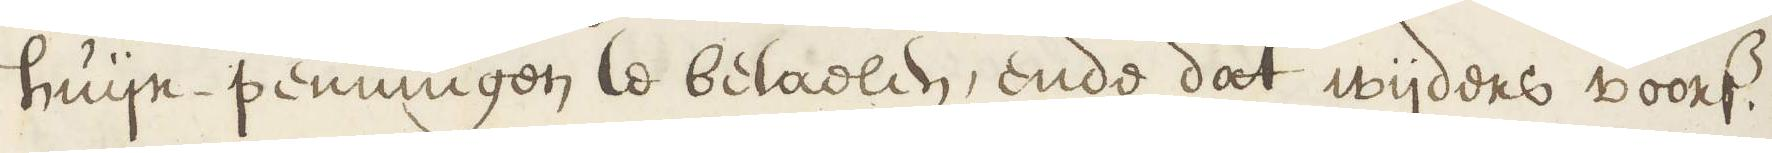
huijr-penningen te betaelen, ende dat wijders voors.
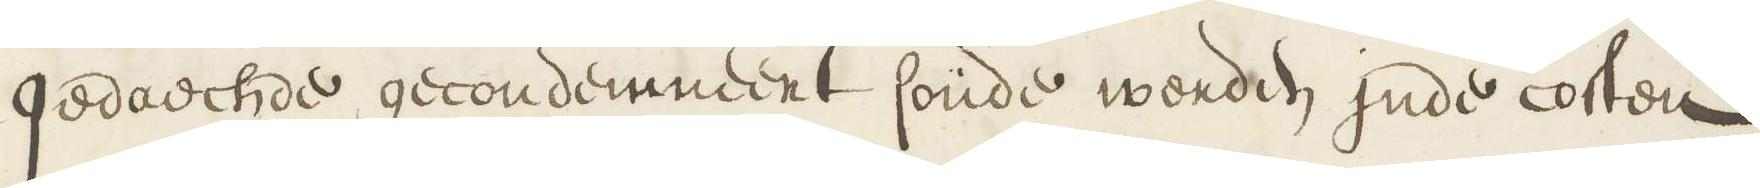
gedaechde gecondemneert soude werden jnde costen
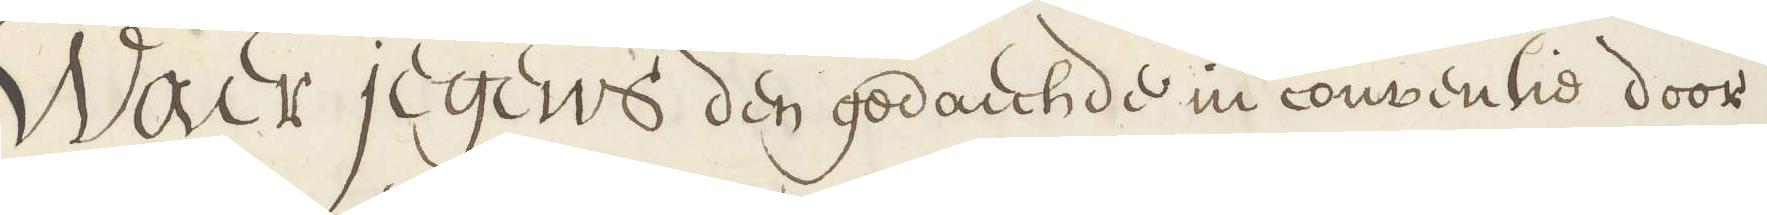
Waer jegens den gedaechde in conventie door
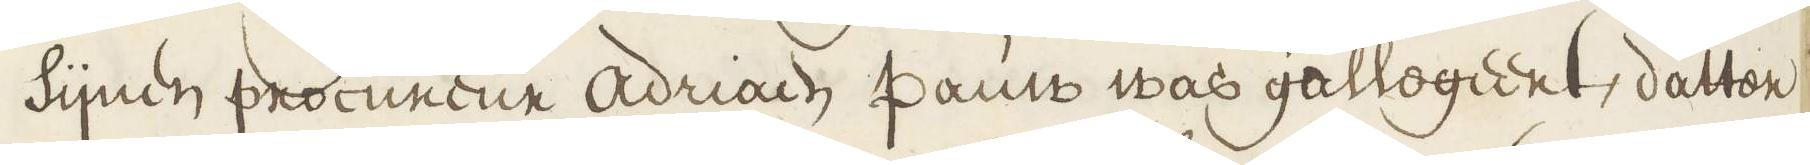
sijnen procureur adriaen pauw was gallogeert, datter
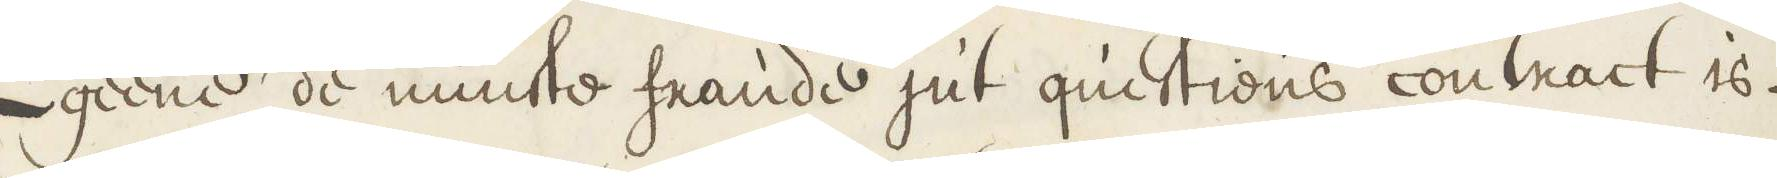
geene de minste fraude jn't questieus contract is
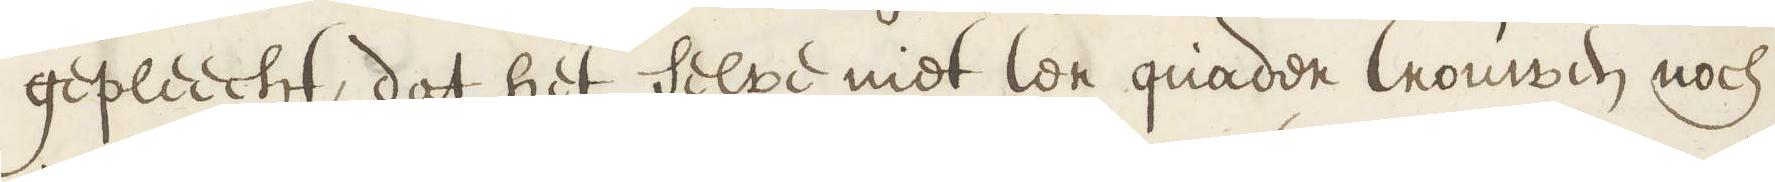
gepleecht, dat het selve niet ter quader trouwen noch
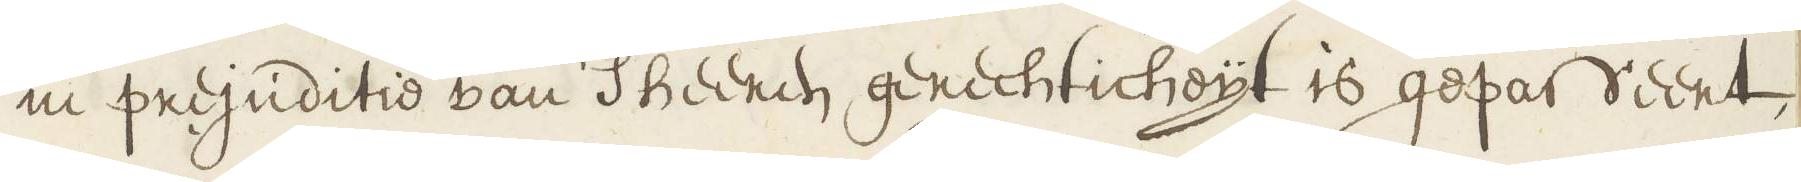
in prejuditie van 's heeren gerechticheijt is gepasseert,
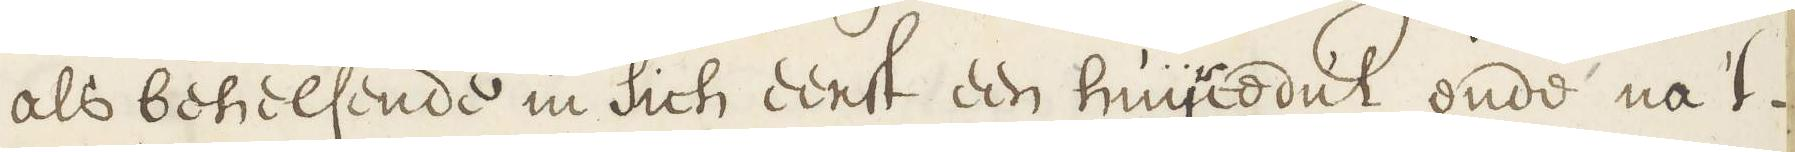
als behelsende in sich eerst een huijrcedul ende na ’t-
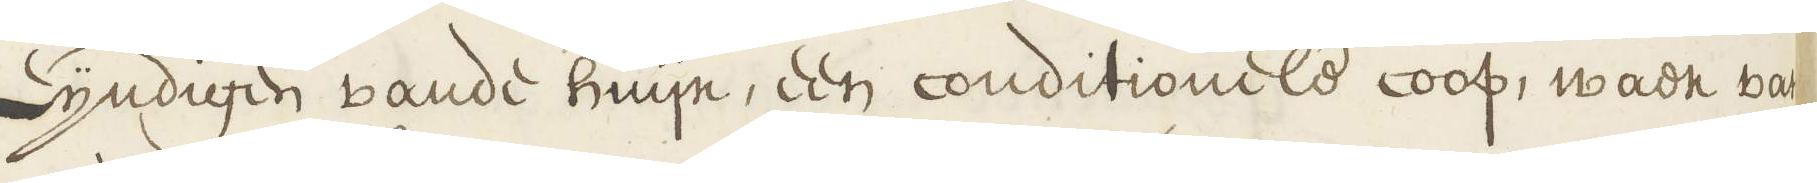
Eijndigen vande huijr, een conditionele coop, waer van
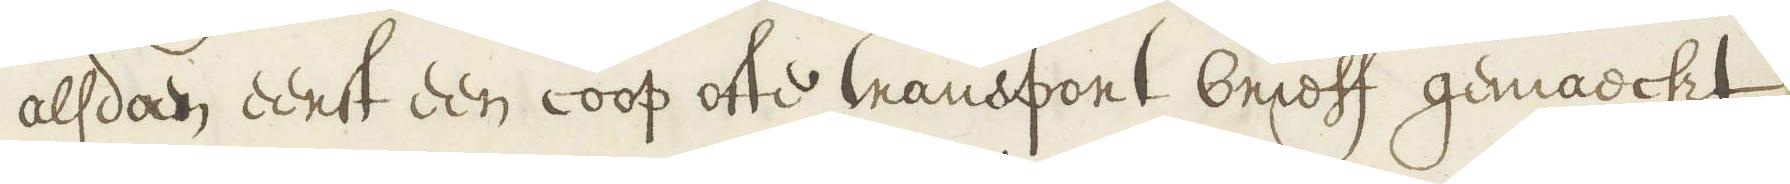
alsdan eerst een coop ofte transport brieff gemaeckt
